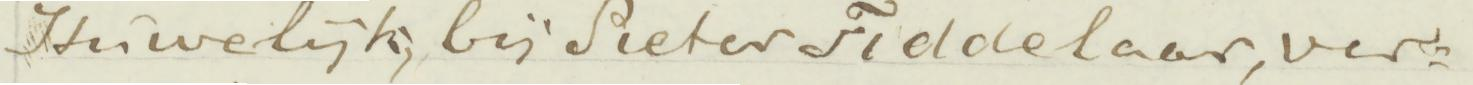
Huwelijk bij Pieter Fiddelaar, ver=
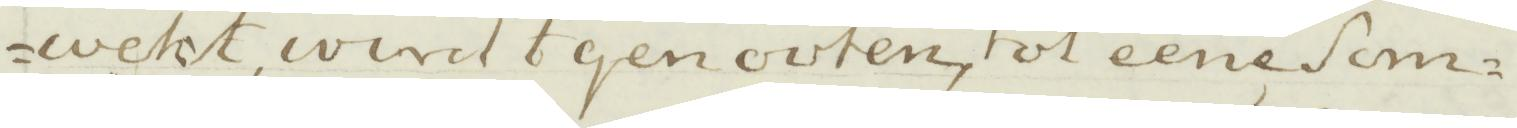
=wekt, wordt genooten, tot eene som=
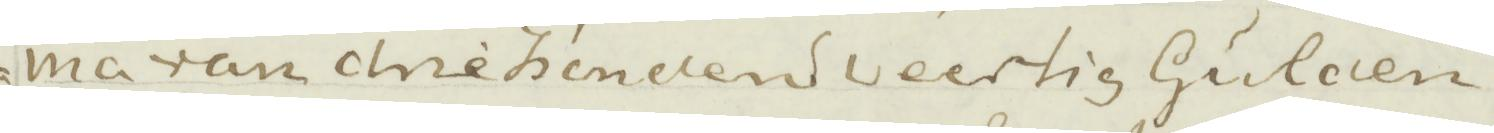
ma van drie honderd veertig Gulden
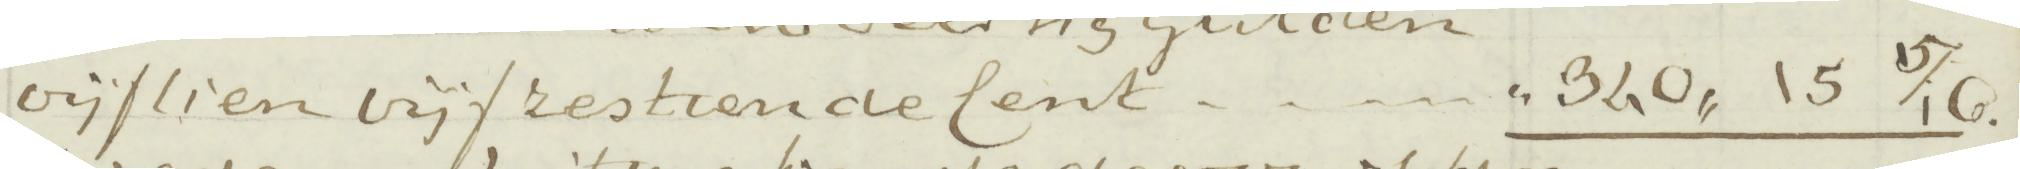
vijftien vijf zestiende Cent - - - - - „ 340„ 15 5/16.
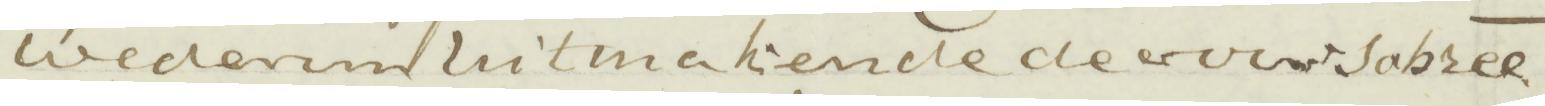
wederom uitmakende de voorschree.
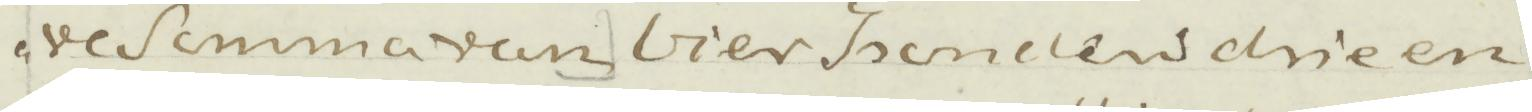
„ve Somma van vier honderd drie en
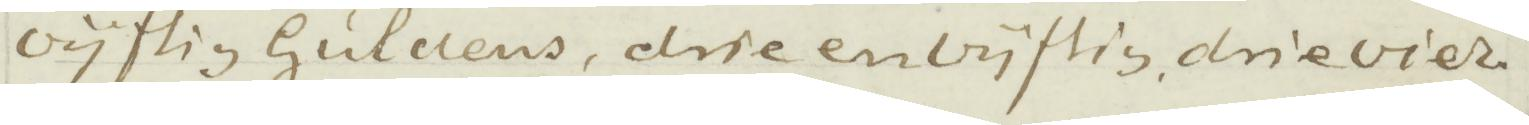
vijftig Guldens, drie en vijftig, drie vier.
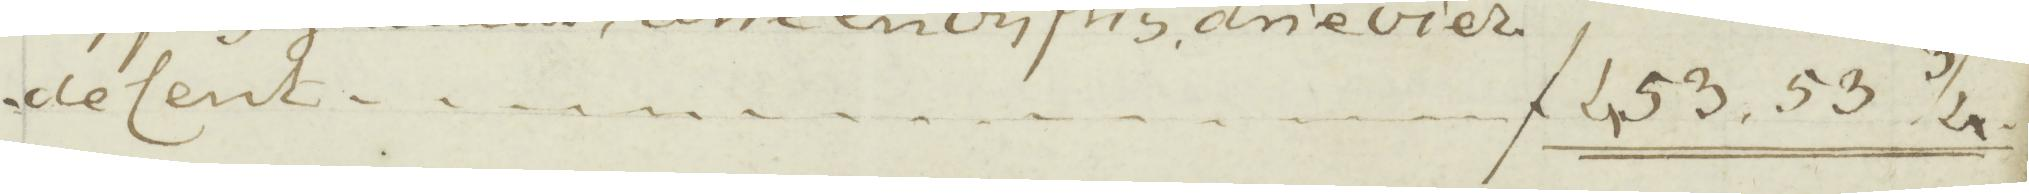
=de Cent - - - - - - - - - - - - - - - - - - ƒ453,53. ¾-
